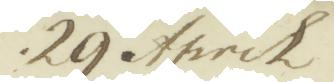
29 April
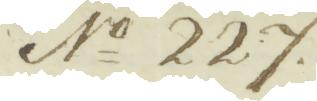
N=o 227.
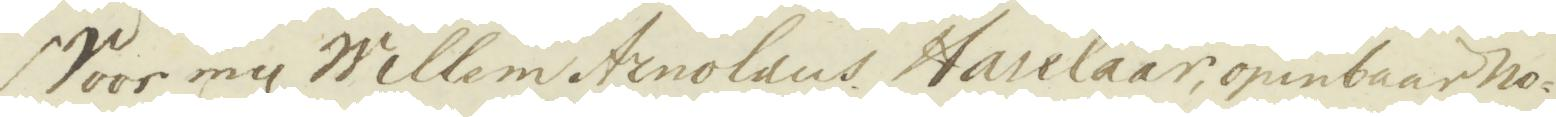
Voor my Willem Arnoldus Haselaar, openbaar No=
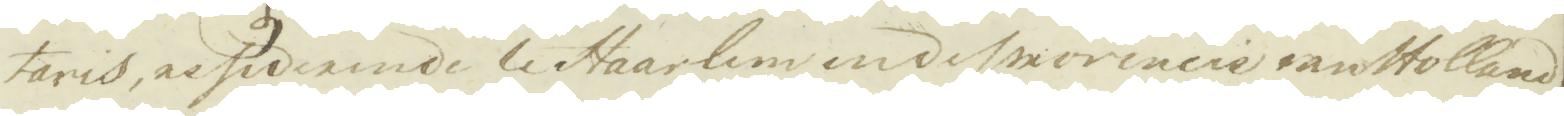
=taris, residerende te Haarlem in de provincie van Holland
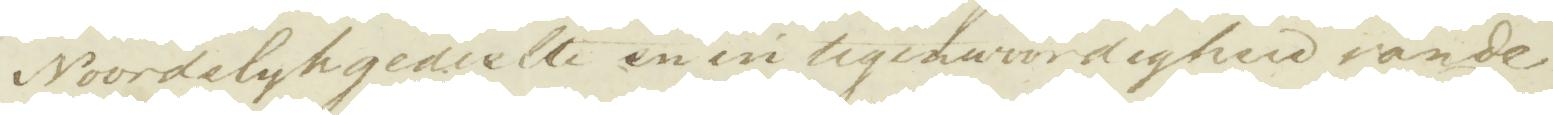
Noordelyk gedeelte en in tegenwoordigheid van de
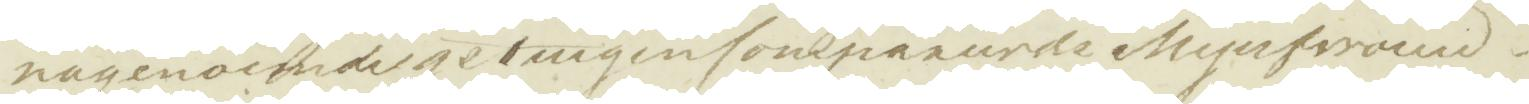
nagenoemde getuigen Compareerde Mejufvrouw
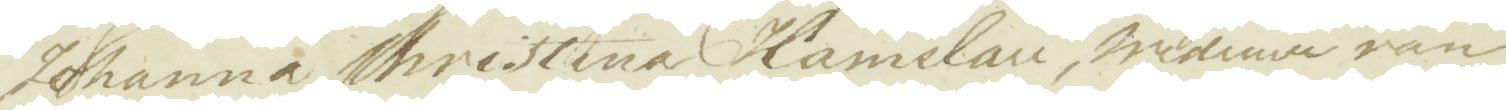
Johanna Christina Hamelau, weduwe van
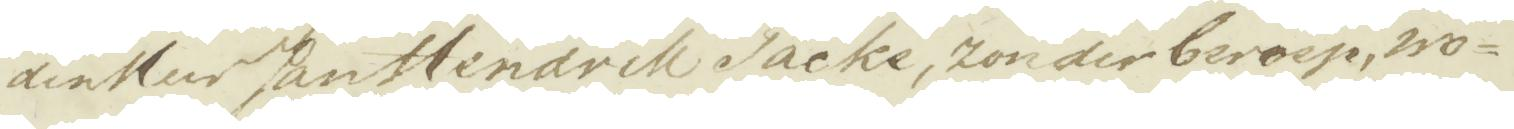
den Heer Jan Hendrik Tacke, zonder beroep, wo=
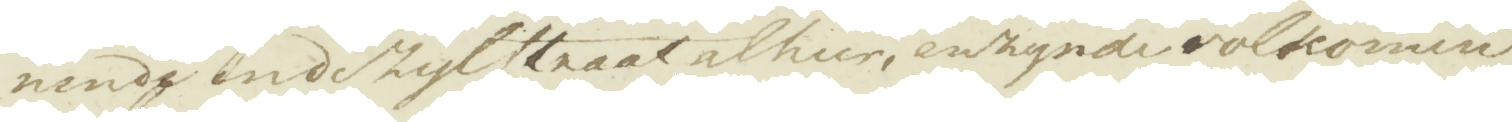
=nende in de zylstraat alhier, en zynde volkomen
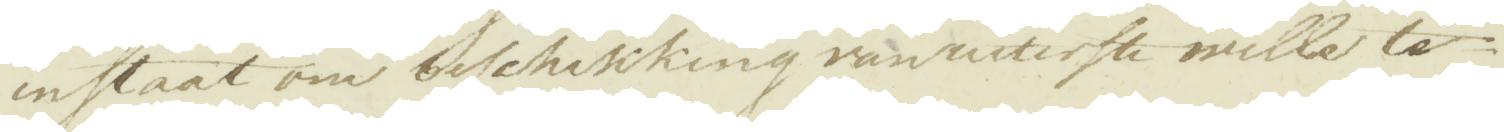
instaat om beschikking van uiterste wille te
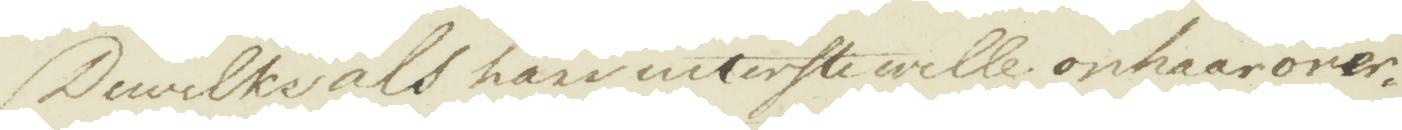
Dewelke als hare uiterste wille op haar over„
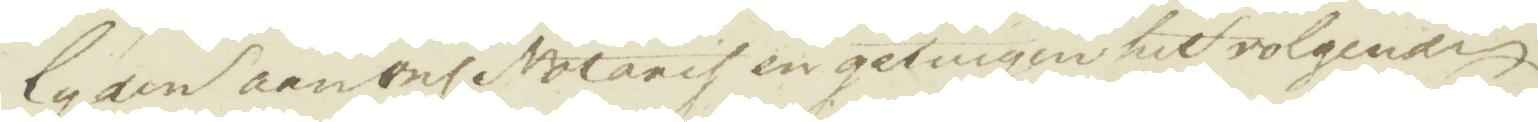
lyden aan ons Notaris en getuigen het volgende
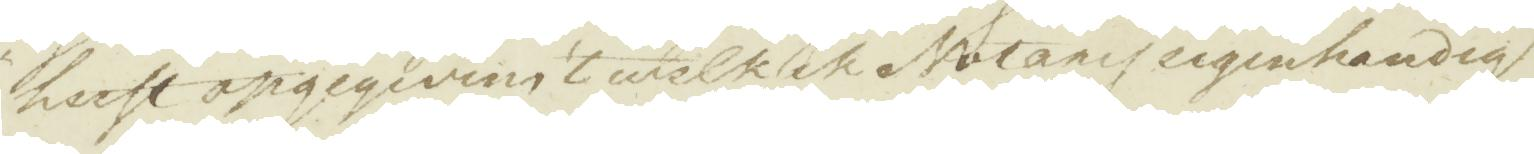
heeft opgegeven ’t welk ik Notaris eigenhandig
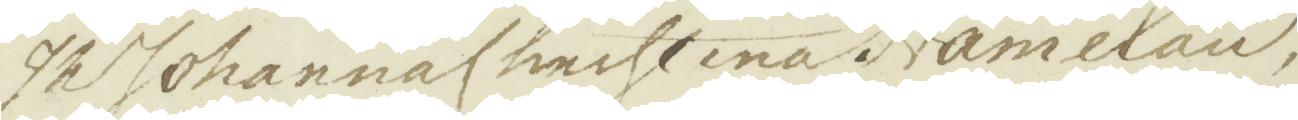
Jk Johanna Christina Hamelau,
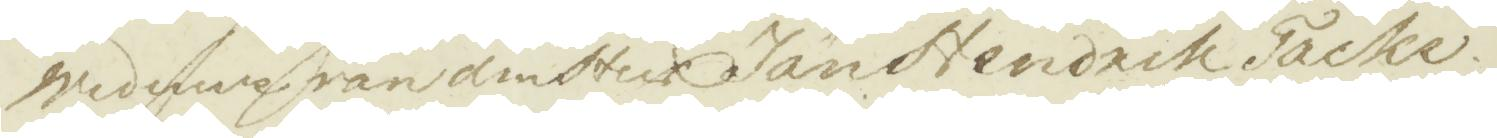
weduwe van den Heer Jan Hendrik Tacke,
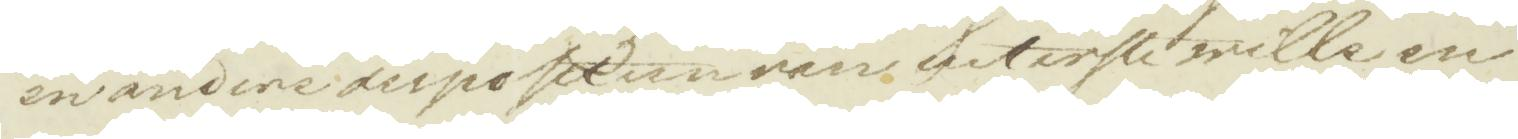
en andere dispositien van uiterste wille en
